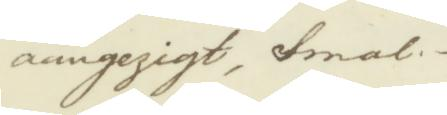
aangezigt, smal. -
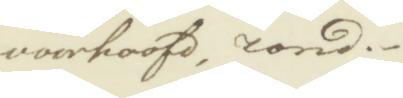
voorhoofd, rond. -
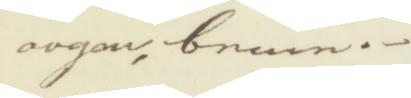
oogen, bruin. -
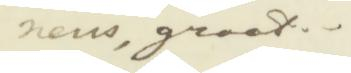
neus, groot. -
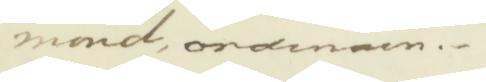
mond, ordinair. -
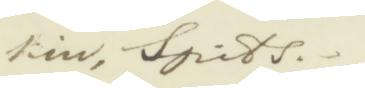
kin, spits. -
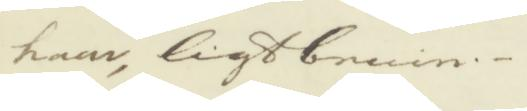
haar, ligtbruin -
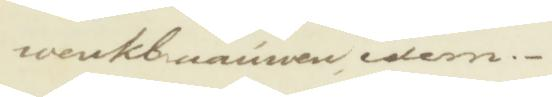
wenkbrauwen idem. -
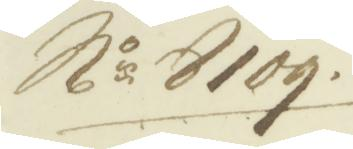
N=o 8109.
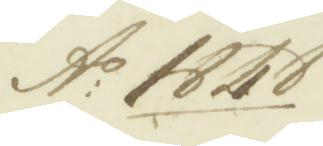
A:o 1848
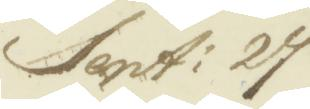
Sept: 27
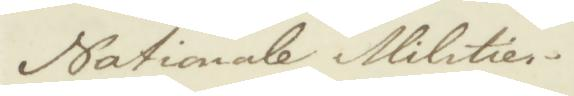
Nationale Militie, -
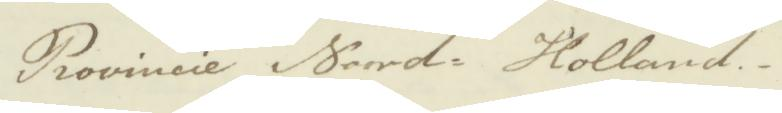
Provincie Noord= Holland. -
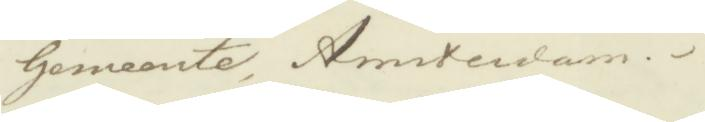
Gemeente, Amsterdam. -
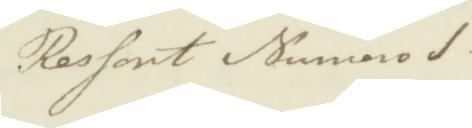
Ressort Numeros
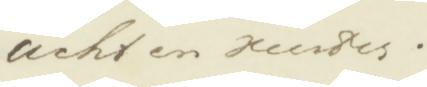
acht en veertig
